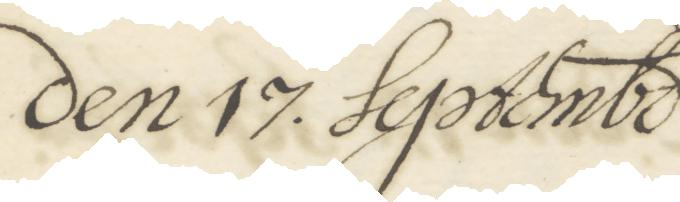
den 17. Septembr
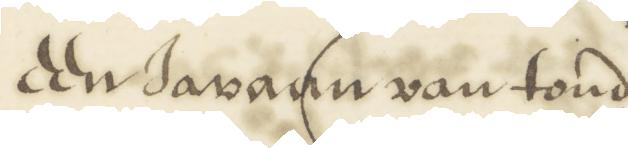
een Javaan van tond
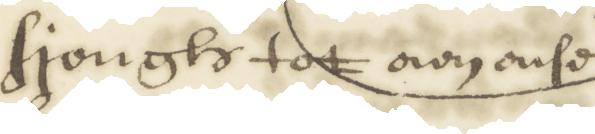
sjongh tot aen onse
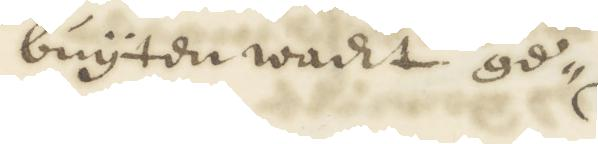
buijten waert ge„
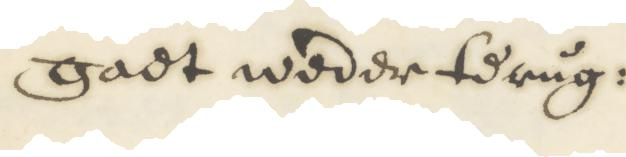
gaet weder terug:
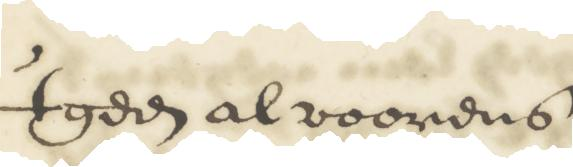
't geen al voorens
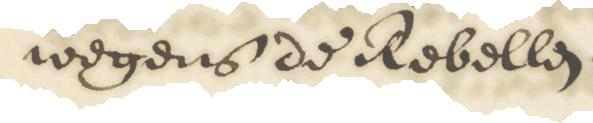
wegens de Rebellen
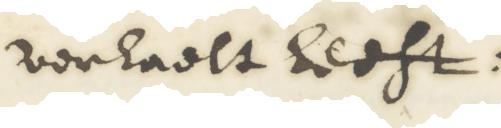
verhaelt heeft:
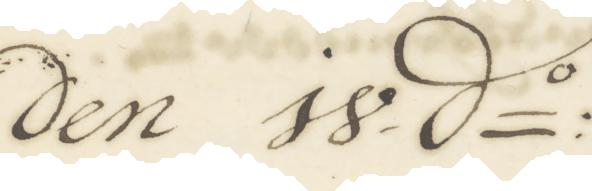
den 18. d=o:
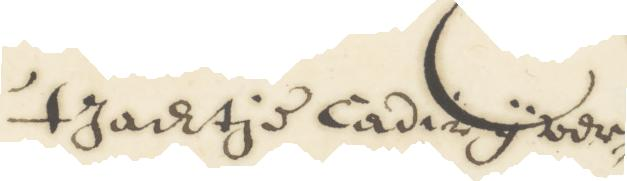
’t Jachtje cadirij ver„
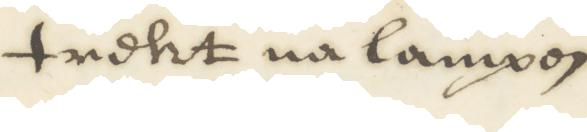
trekt na lampon
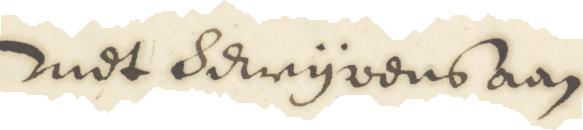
met schrijvens aan
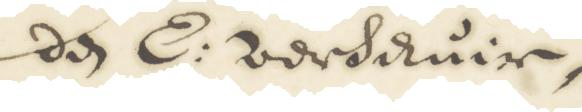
den E: verschuir,
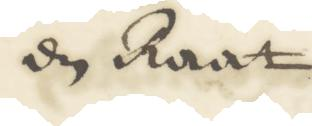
en Raat
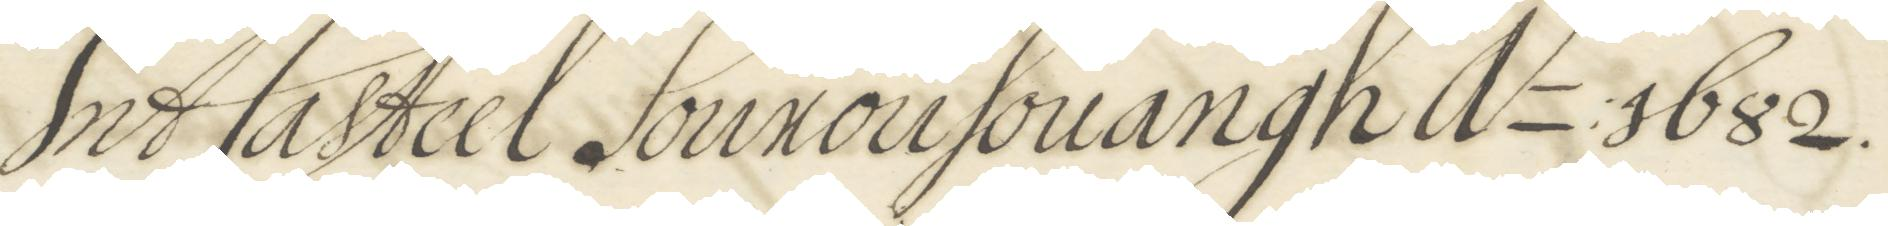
Int Casteel Sourousouangh A=o: 1682.
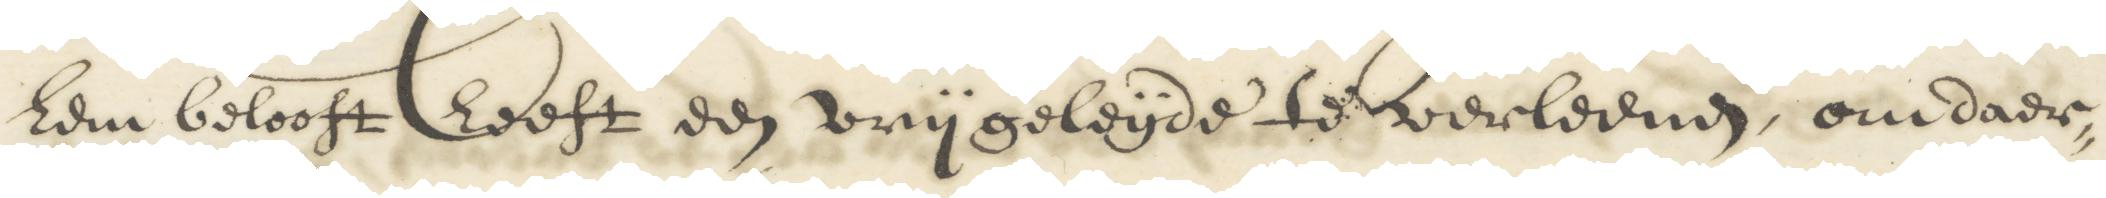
hem belooft heeft een vrijgeleijde te verleenen, om daer„
